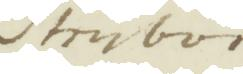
Strybos
